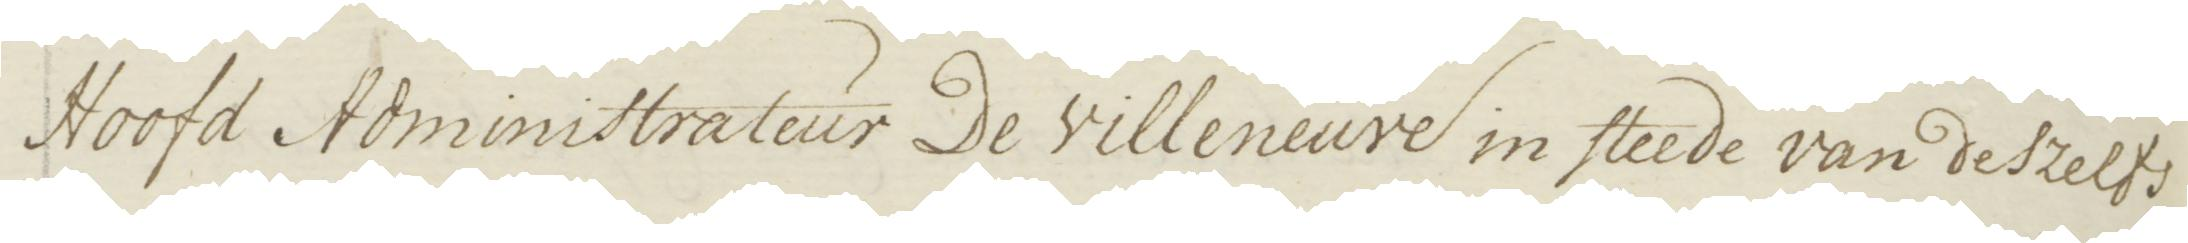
Hoofd Administrateur De Villeneuve in steede van deszelfs
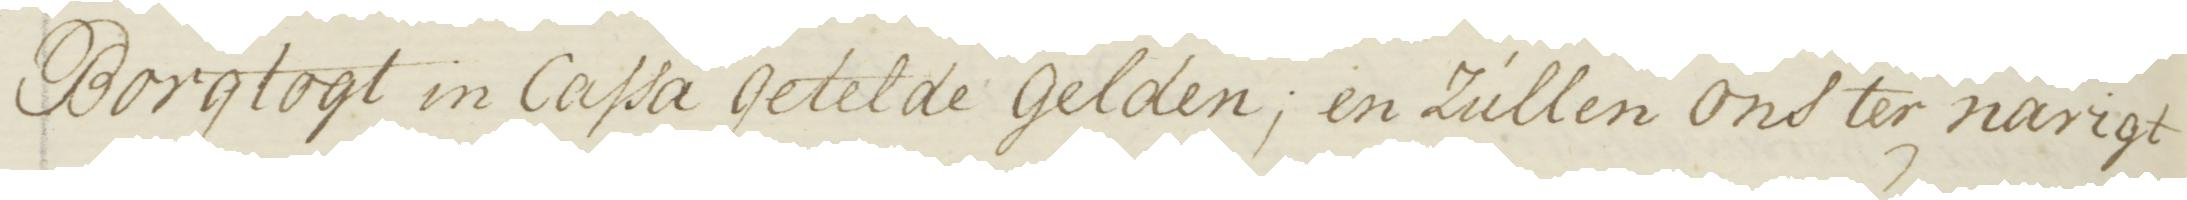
Borgtogt in Cassa getelde gelden; en zullen ons ter narigt
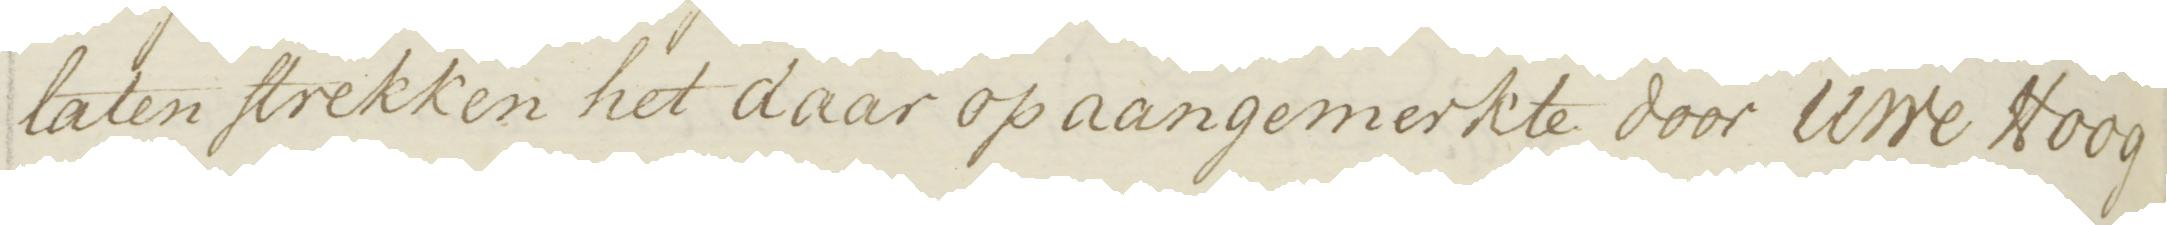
laten strekken het daar op aangemerkte door uwe Hoog
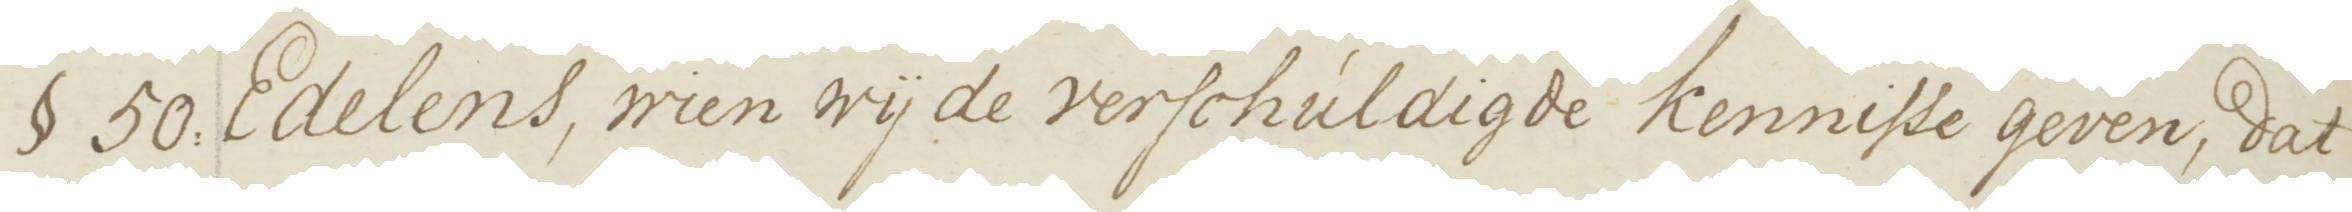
§ 50: Edelens, wien wij de verschuldigde kennisse geven, dat
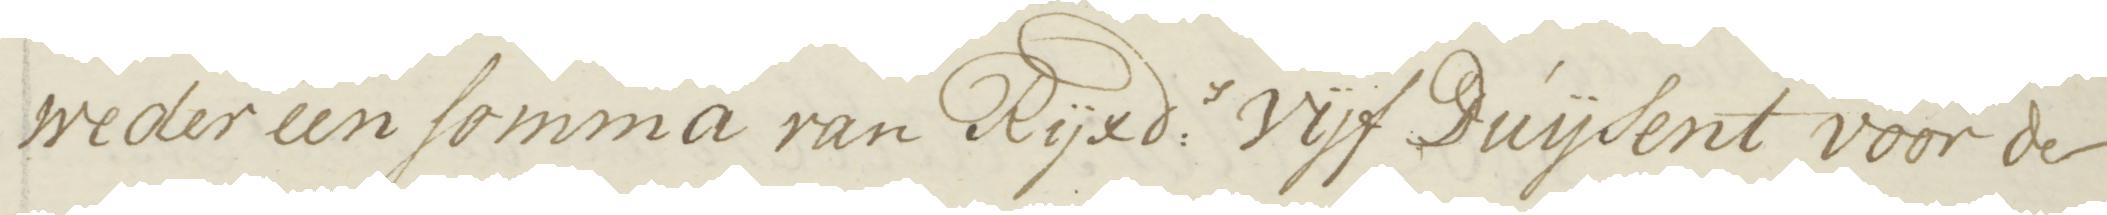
weder een somma van Rijxd:s vijf Duijsent voor de
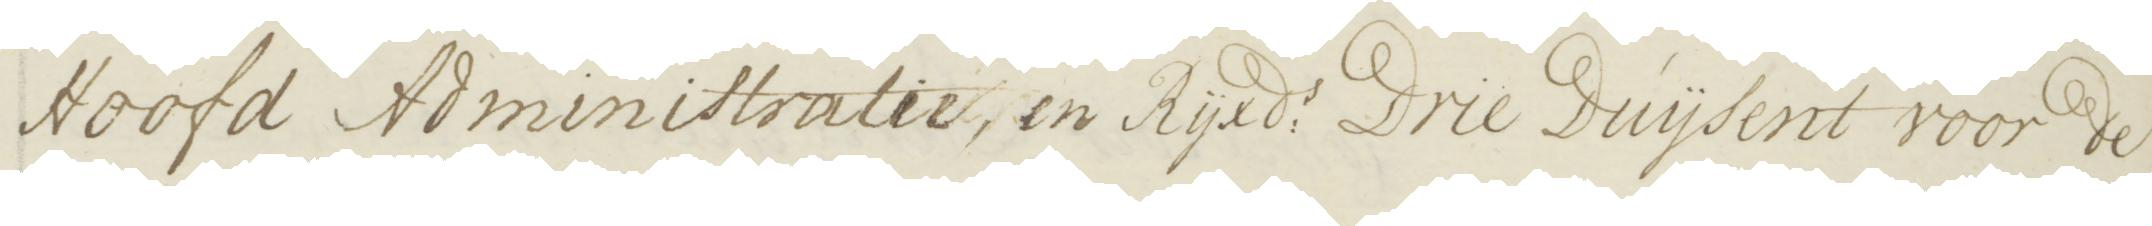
Hoofd Administratie, en Rijxd:s Drie Duijsent voor de
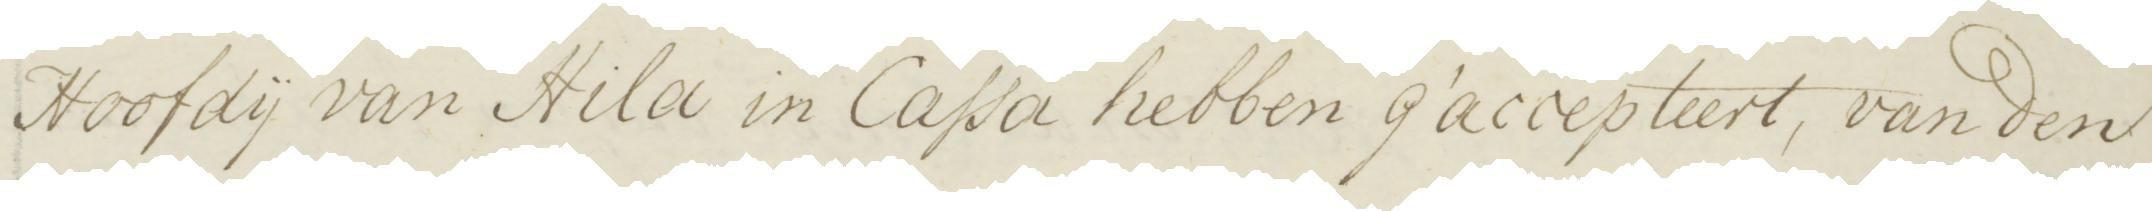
Hoofdij van Hila in Cassa hebben g’accepteert, van den
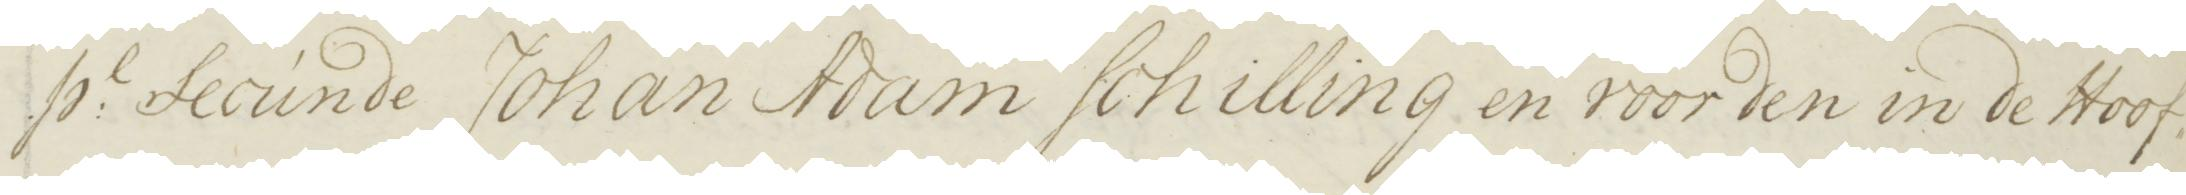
p:l secunde Johan Adam Schilling en voor den in de Hoof
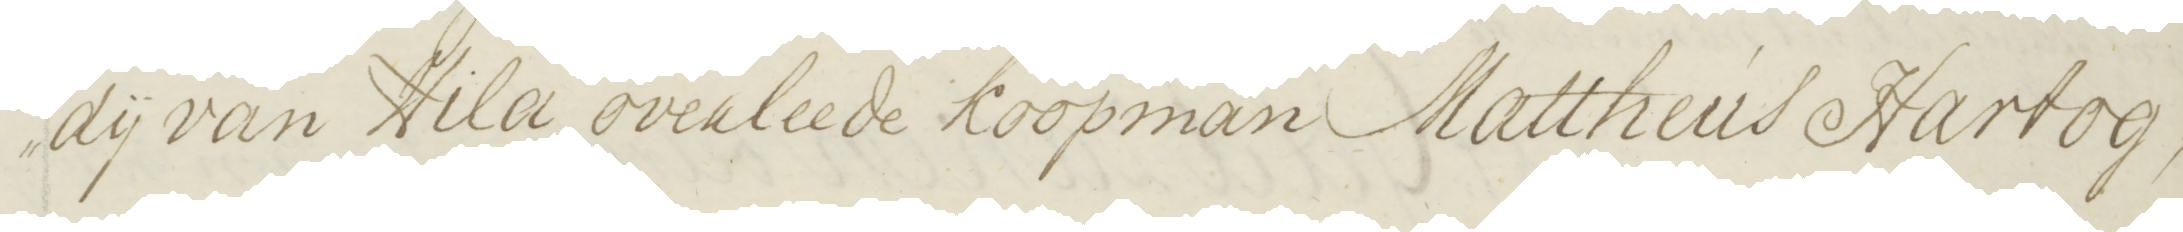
„dij van Hila overleede koopman Mattheus Hartog
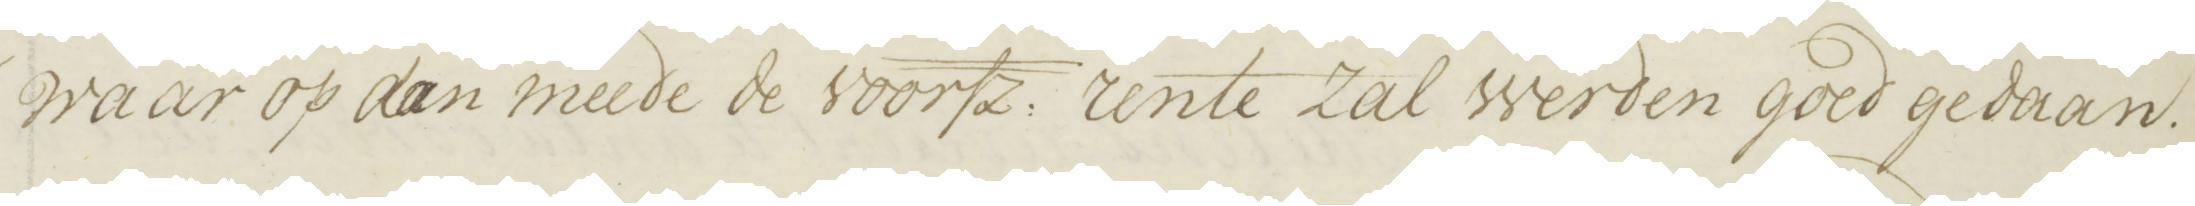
waar op dan meede de voorsz: rente zal werden goed gedaan.
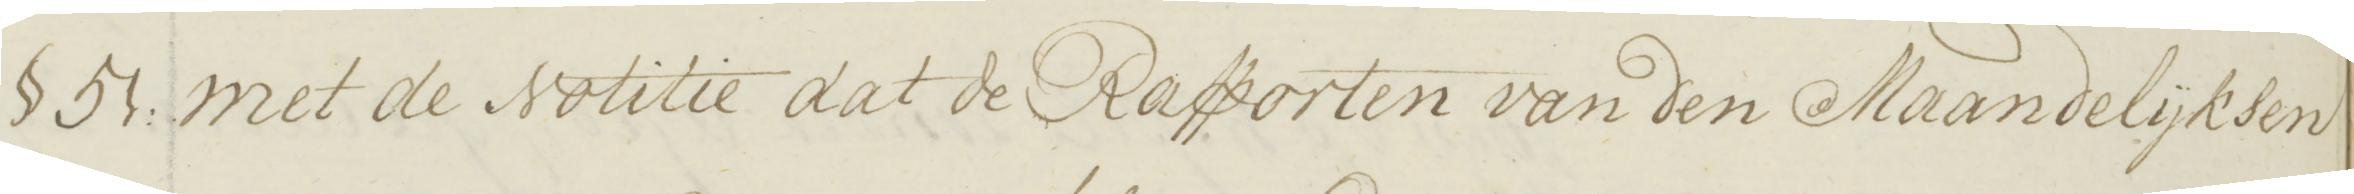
§ 51: met de Notitie dat de Rapporten van den Maandelijksen
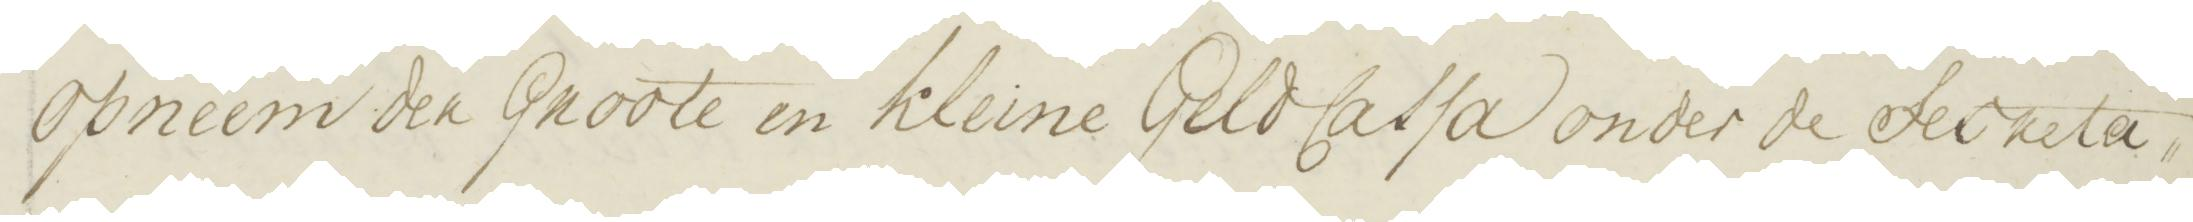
opneem der Groote en kleine Geld Cassa onder de Secreta„
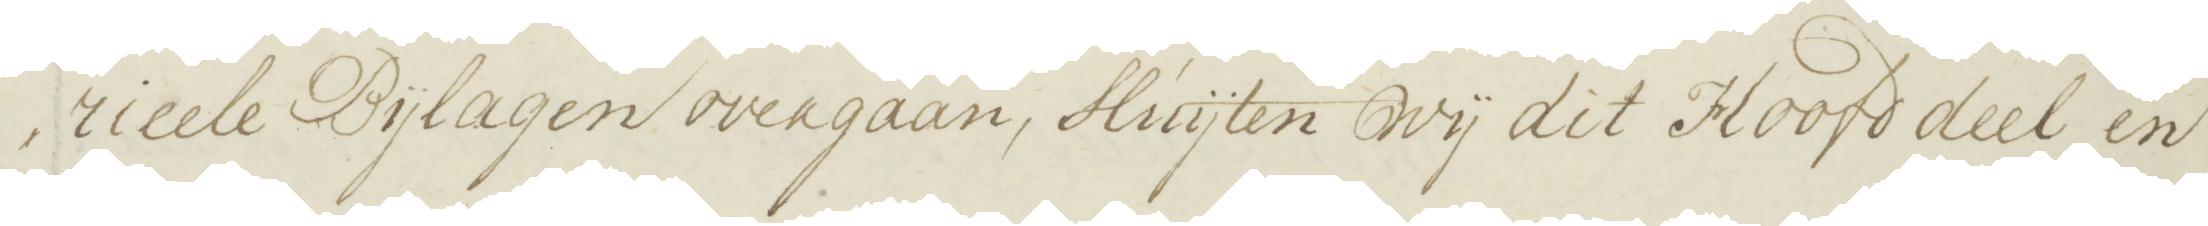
„rieele Bijlagen overgaan, sluijten wij dit Hoofd deel en
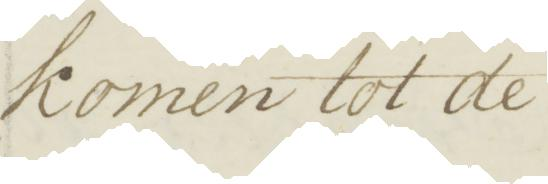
komen tot de
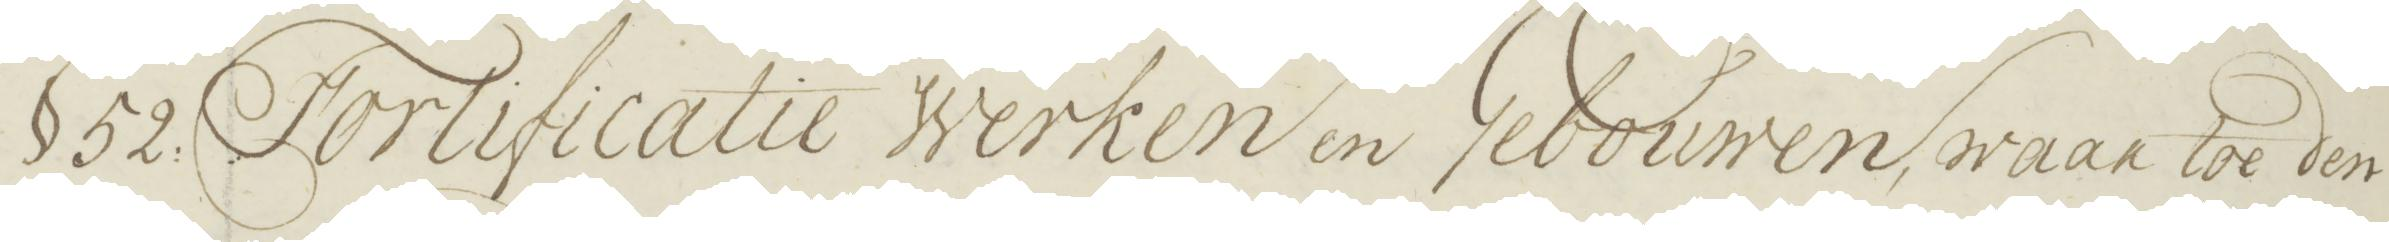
§ 52: Fortificatie werken en Gebouwen, waar toe den
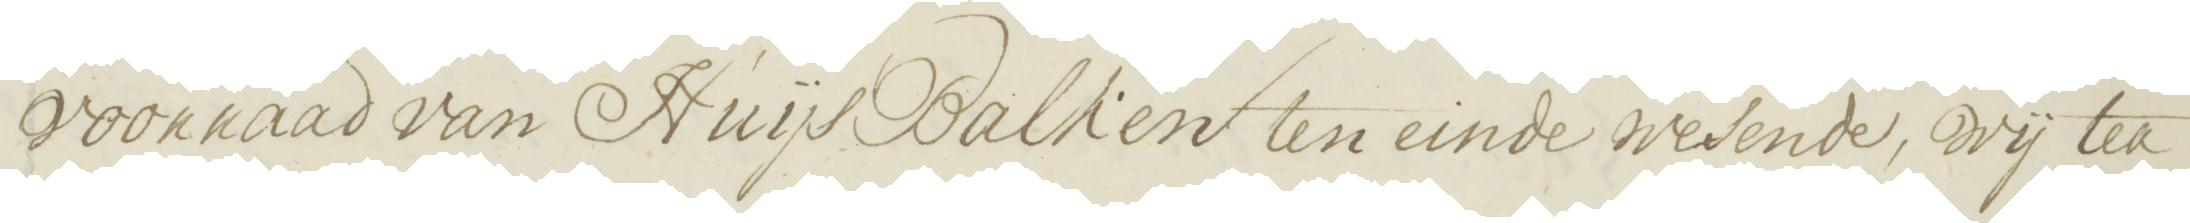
voorraad van Huijs Balken ten einde wesende, wij ter
